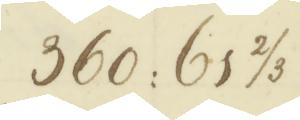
360:61 2/3
